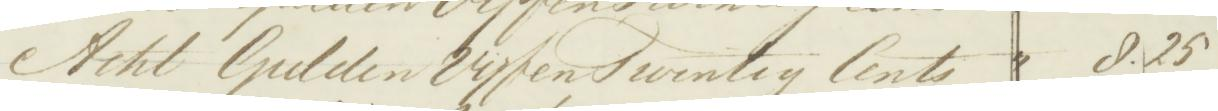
Acht Gulden Vijfen Twintig Cents „ 8.25
